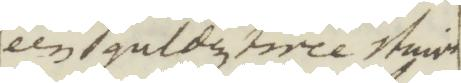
een gulden twee stuivs
